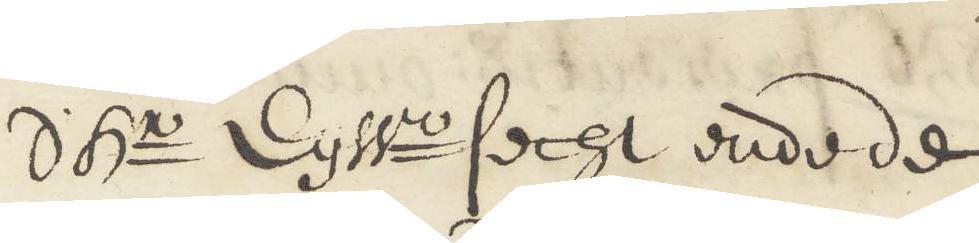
d' h=r Eijss=r secht ende de
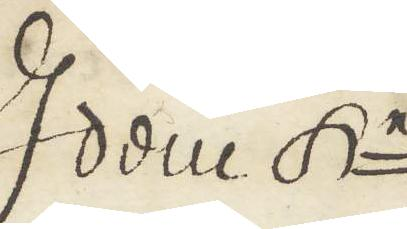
Jdem h=r
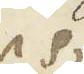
^sulcx
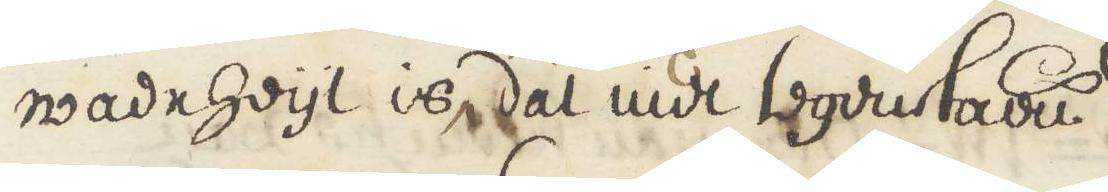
waerheijt is ^ dat niet tegenstaen
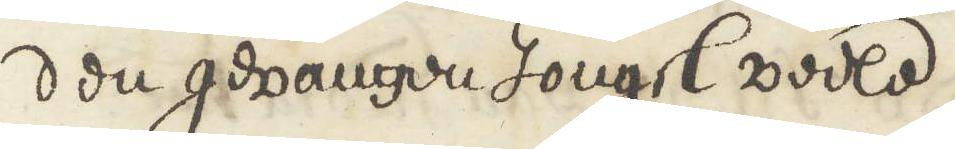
den gevangen Jongst veele
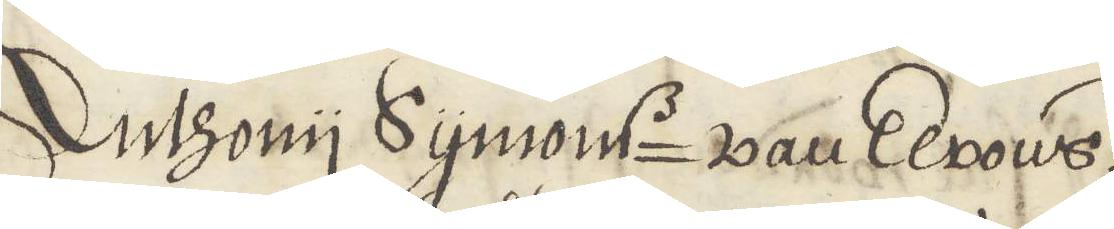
Anthonij Sijmons=z van Elvous
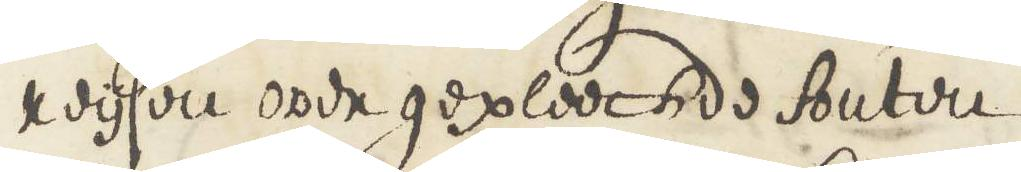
reijsen over gepleechde fouten
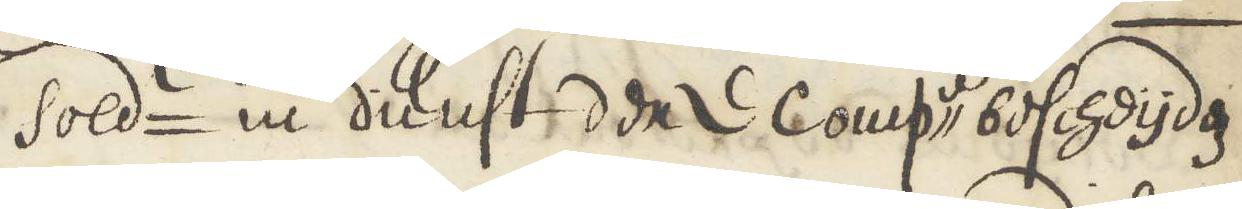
sold=t in dienst der E Comp„e bescheijden
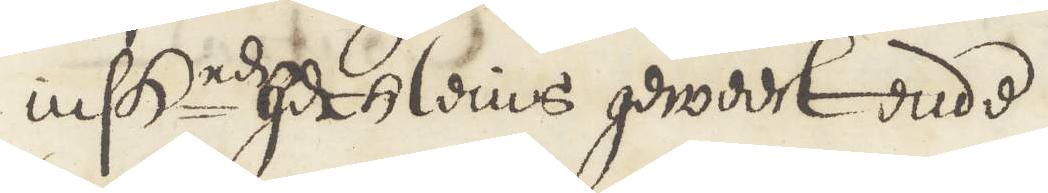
ins h=re hechtenis geweest ende
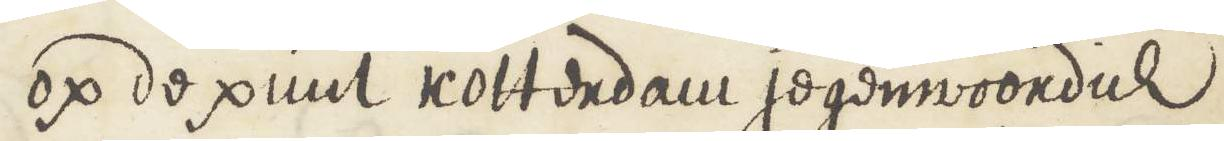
op de punt rotterdam tegenwoordich
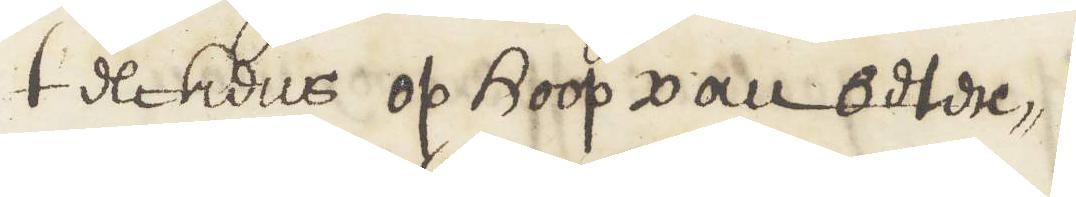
telckens op hoop van beter„
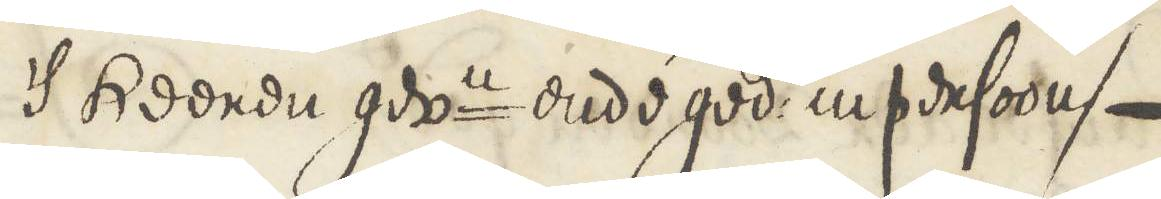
's Heeren gev=n ende ged:e in persoon/ —
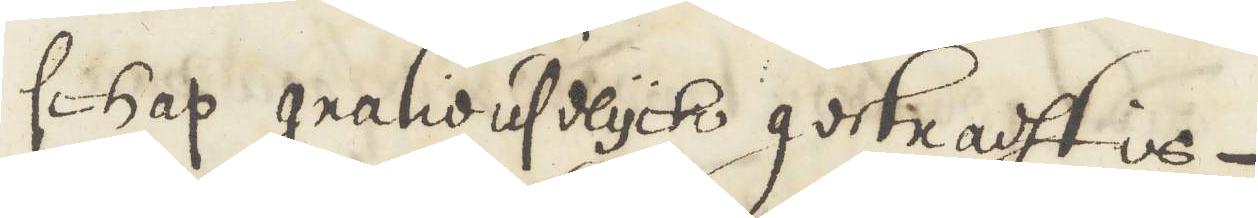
schap gratieuselijck gestraeft is —
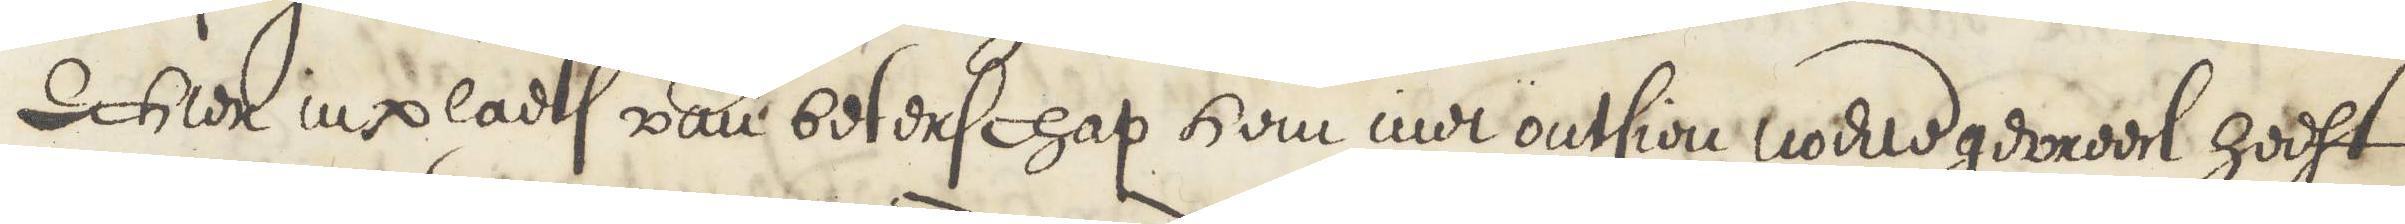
Echter in plaets van beterschap hem niet ontsien nochte gevreest heeft
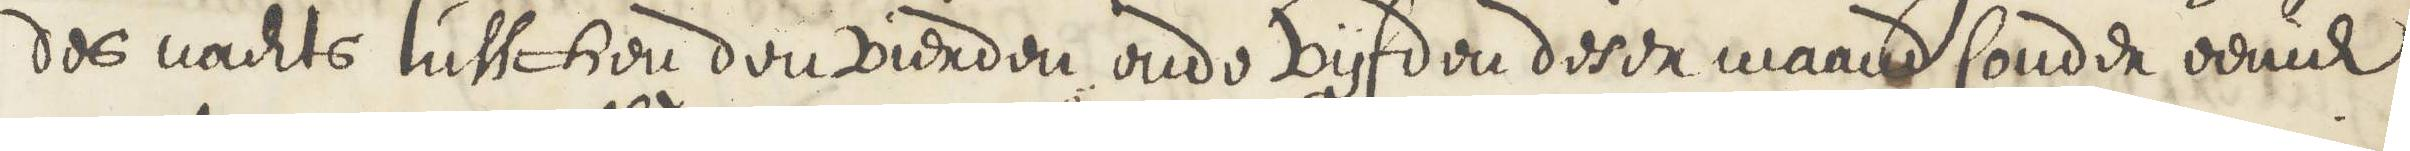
des nachts tusschen den vierden ende vijfden deser maand sonder eenich
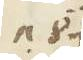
sijn
